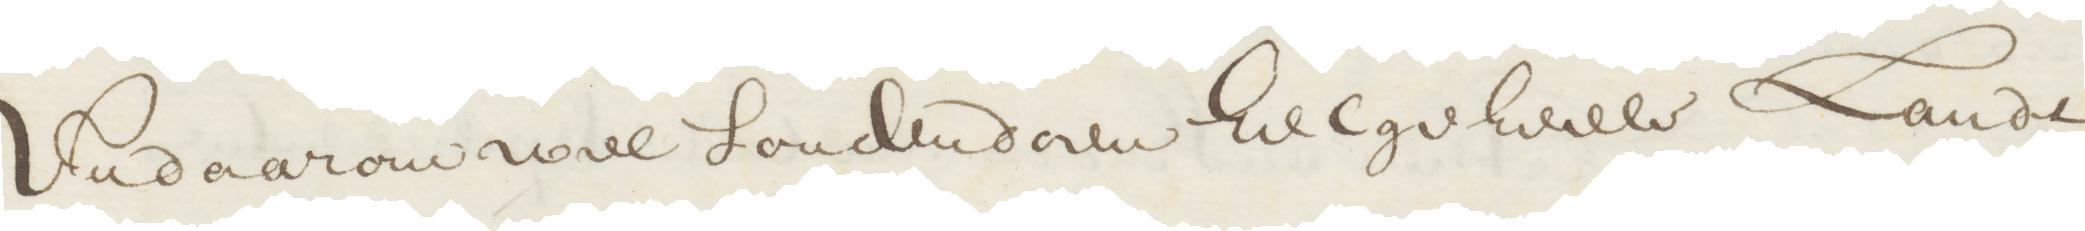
En daarom wel souden doen het geheele Lande
